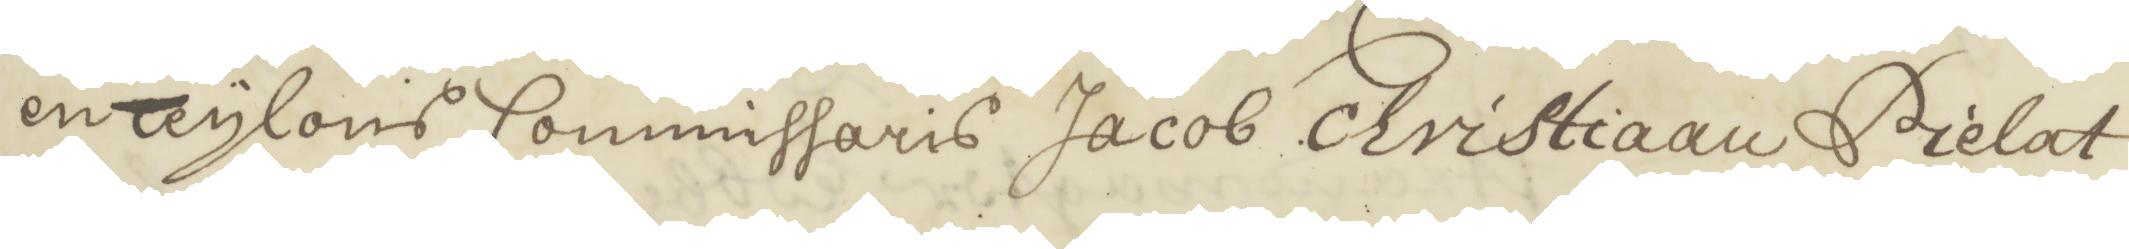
en ceijlons Commissaris Jacob Christiaan Pielat
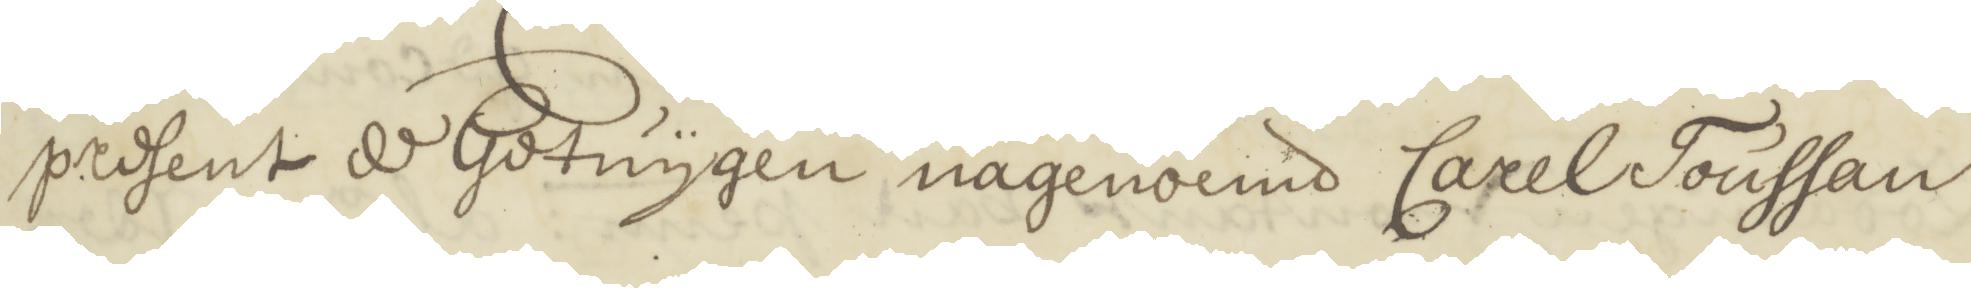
present de Getuijgen nagenoemd Carel Toussan
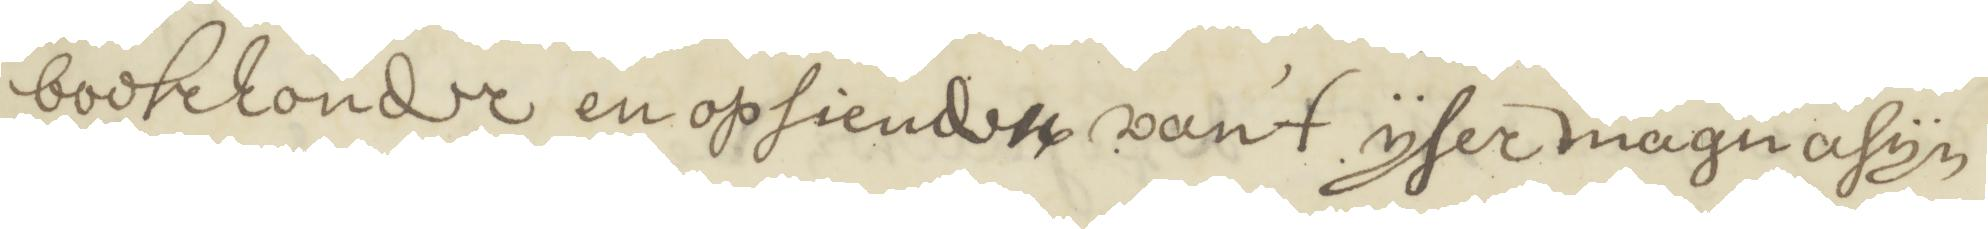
boekhouder en opsiender van ’t ijser maguasijn
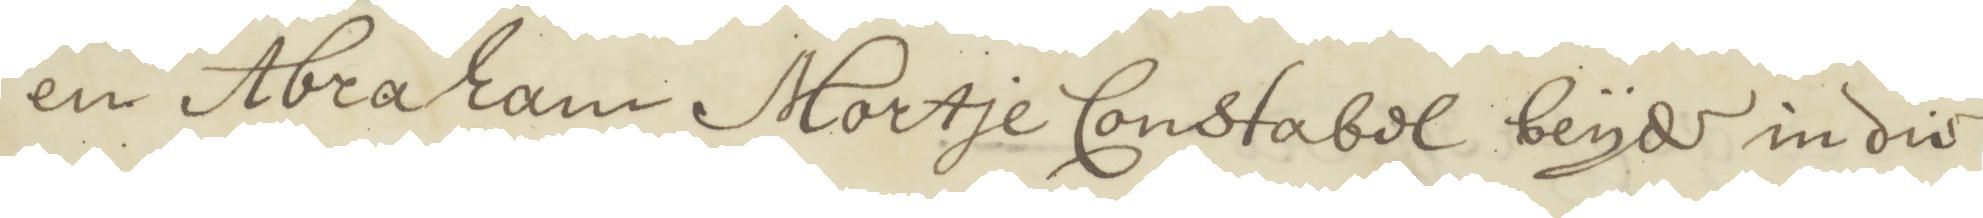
en Abraham Mortje Constabel beijde in die
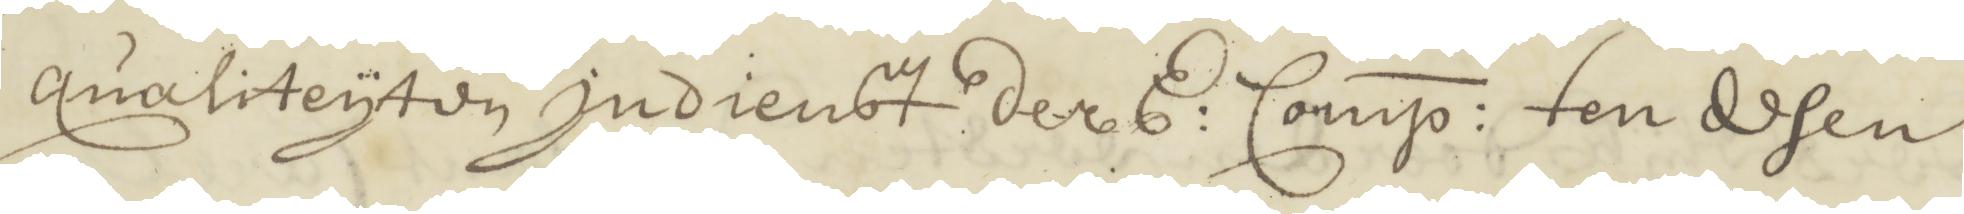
qualiteijten jn dienst der E: Comp: ten desen
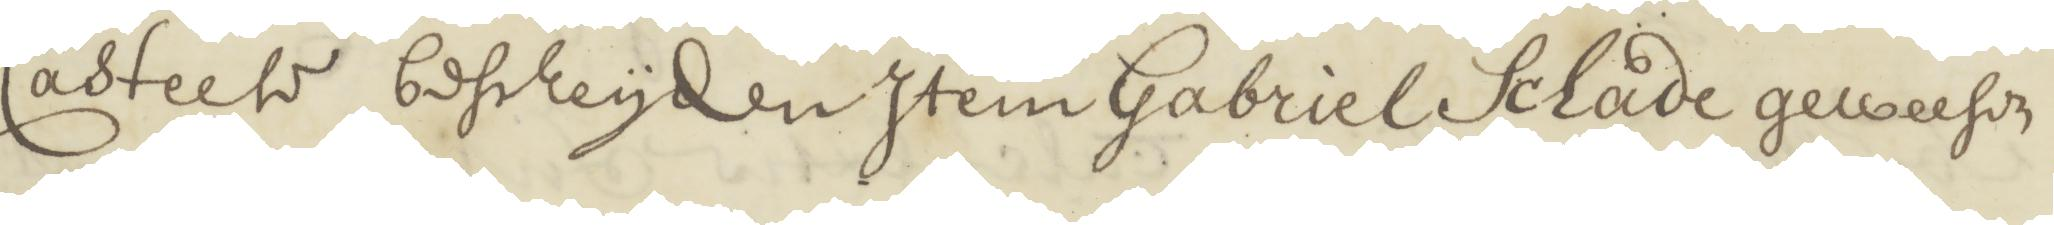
Casteele bescheijden Jtem Gabriel Schade geweesen
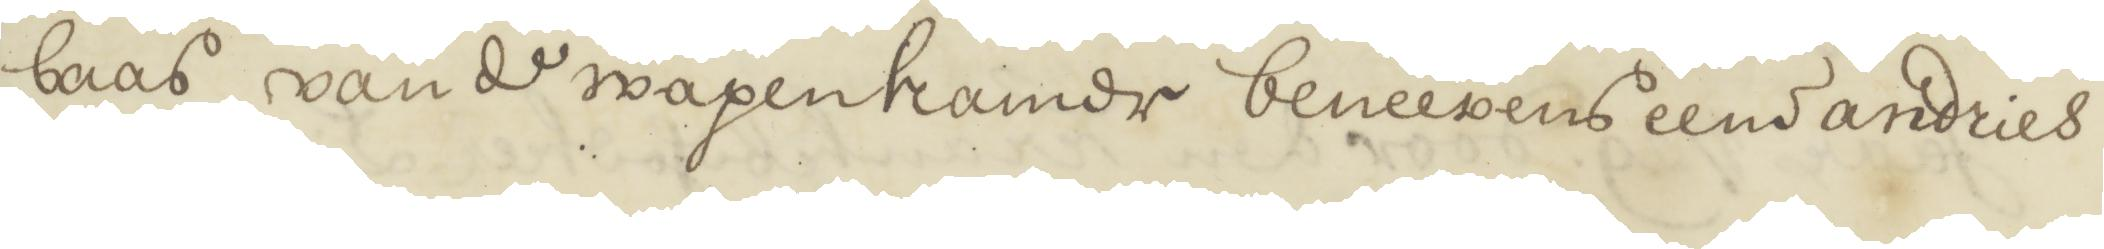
baas van de wapenkamer beneevens eene andries
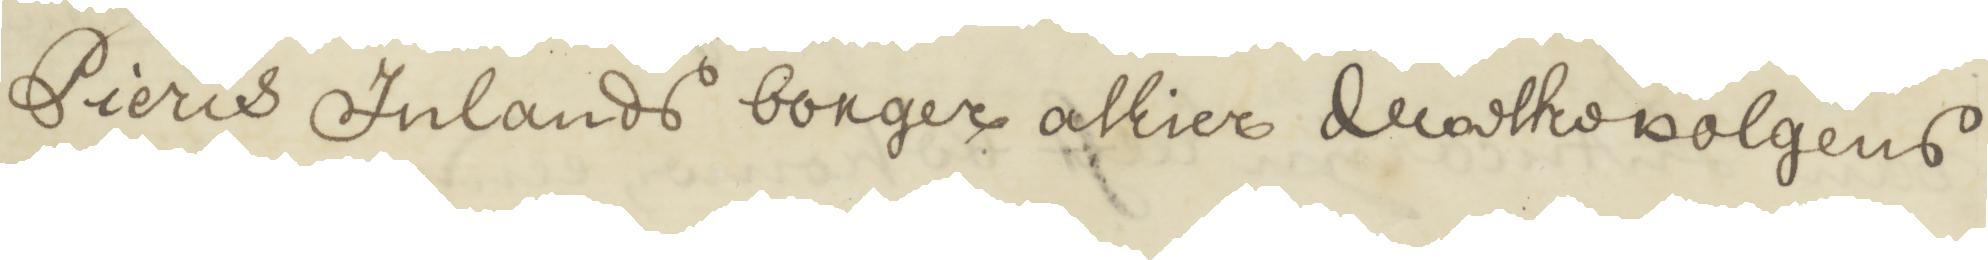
Pieris Inlands borger alhier dewelke volgens
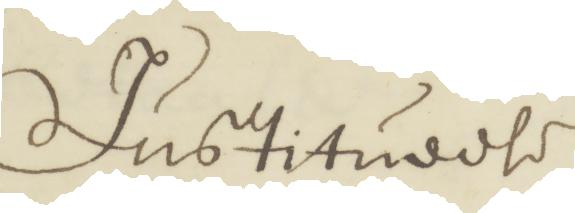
Iustitueele
